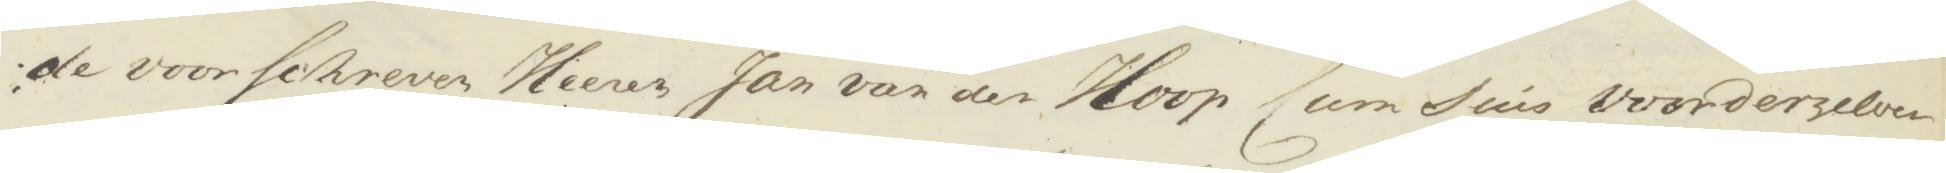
de voorschreven Heeren Jan van der Hoop Cum suis voor derzelven
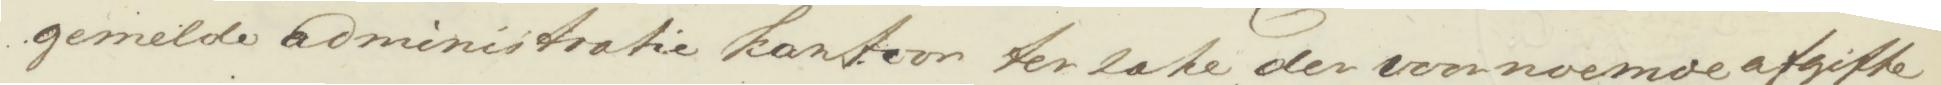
gemelde administratie kantoor ter zake der voornoemde afgifte
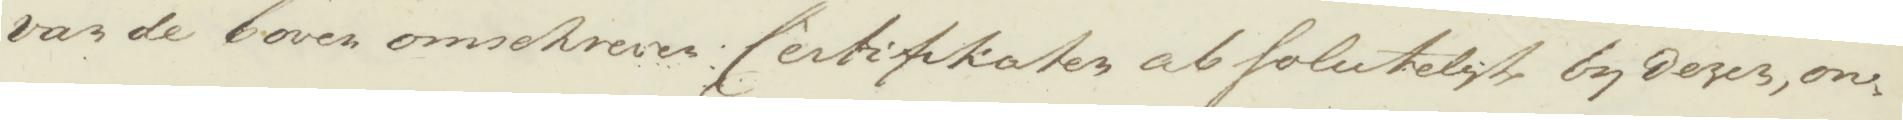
van de boven omschreven Certifikaten absolutelijk by dezen, on„
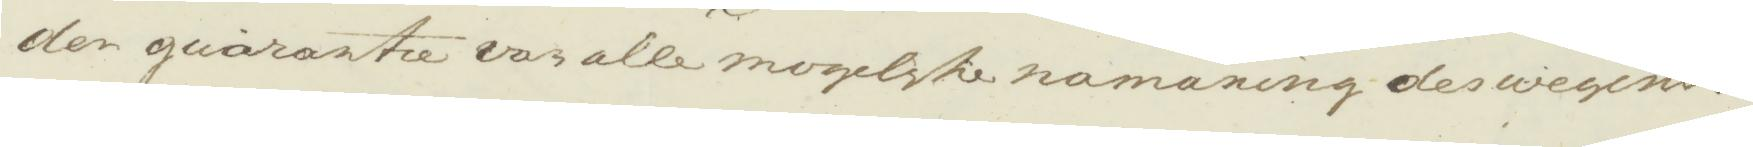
der guarantie van alle mogelyke namaning des wegens.
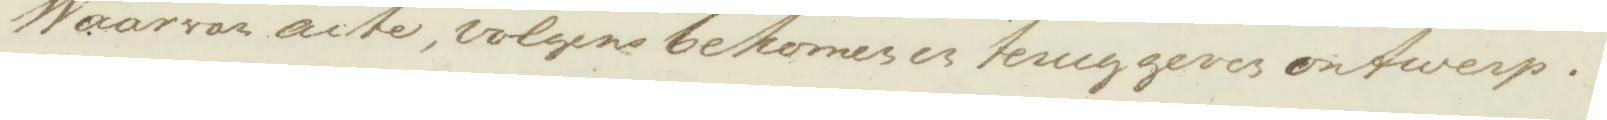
Waarvan acte, volgens bekomen en terug geven ontwerp.
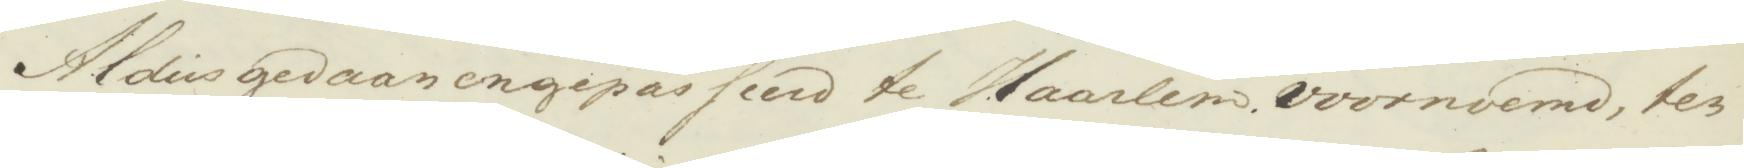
Aldus gedaan en gepasseerd te Haarlem, voornoemd, ten
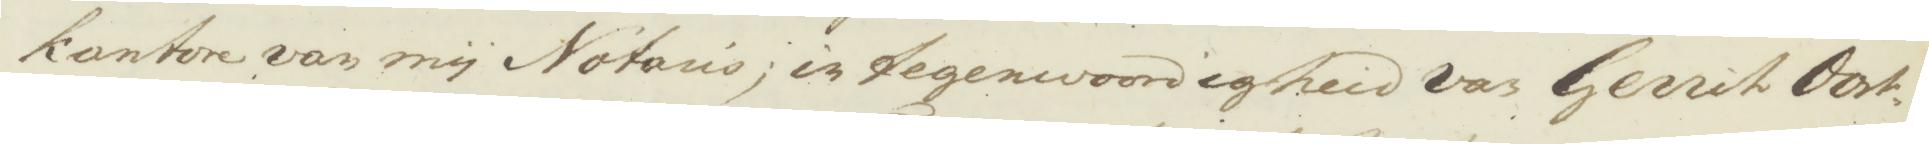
kantore van mij Notaris; in tegenwoordigheid van Gerrit Oost„
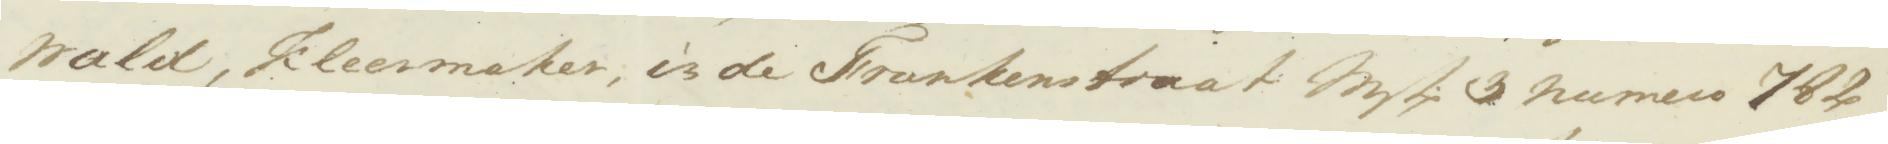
wald, kleermaker, in de Frankenstraat wyk 3 numero 782
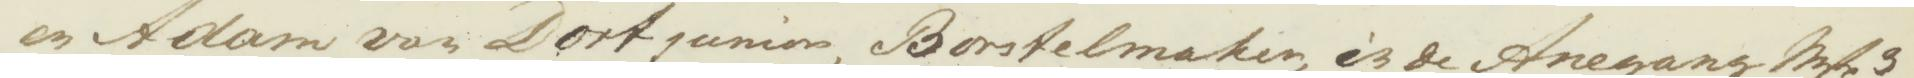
en Adam van Dort junior, Borstelmaker, in de Anegang wyk 3
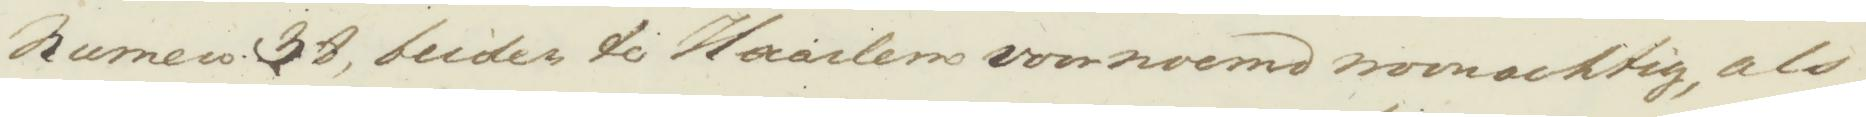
numero 38, beiden te Haarlem voornoemd woonachtig, als
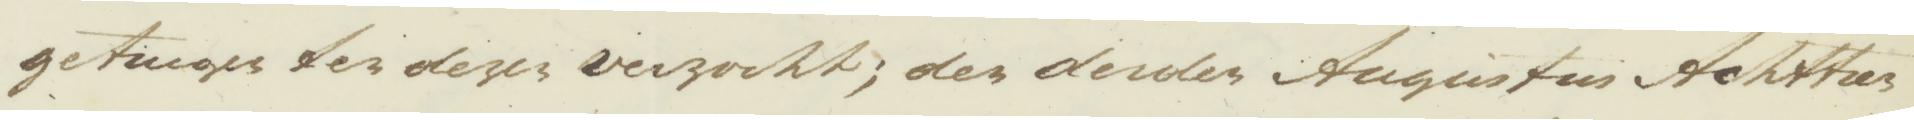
getuigen ten dezen verzocht; den derden Augustus Achttien
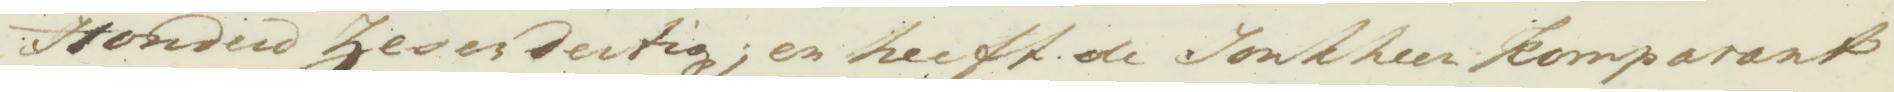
Honderd Zes en dertig; en heeft de Jonkheer komparant
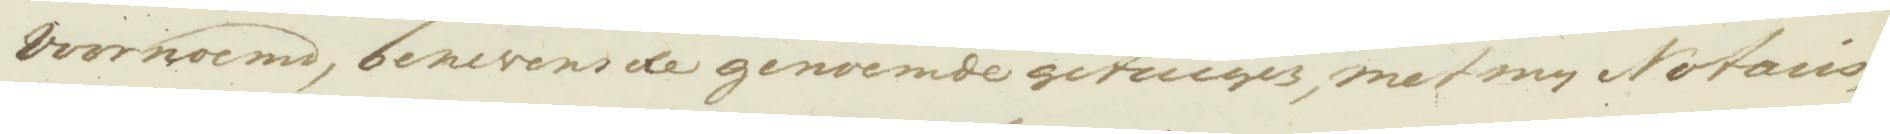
voornoemd, benevens de genoemde getuigen, met my Notaris,
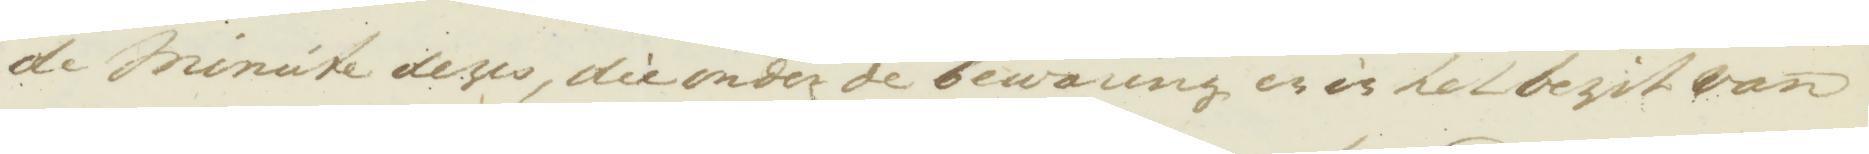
de minute dezes, die onder de bewaring en in het bezit van
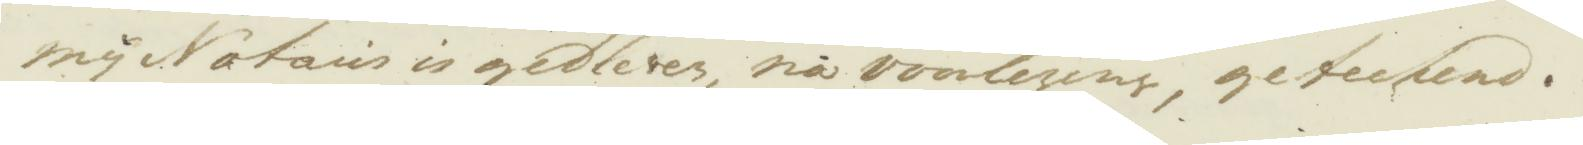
mij Notaris is gebleven, na voorlezing, geteekend.
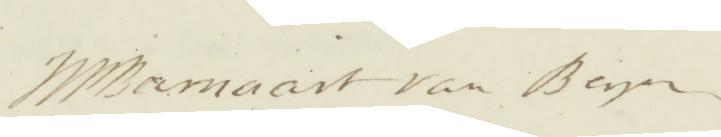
WBarnaart van Beyer
